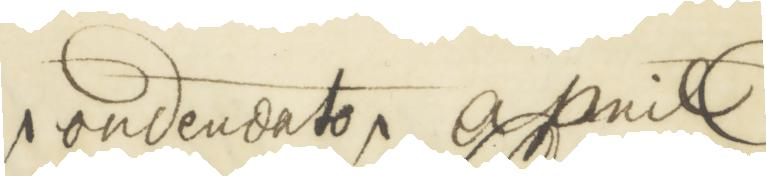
^ onderdato ^ April
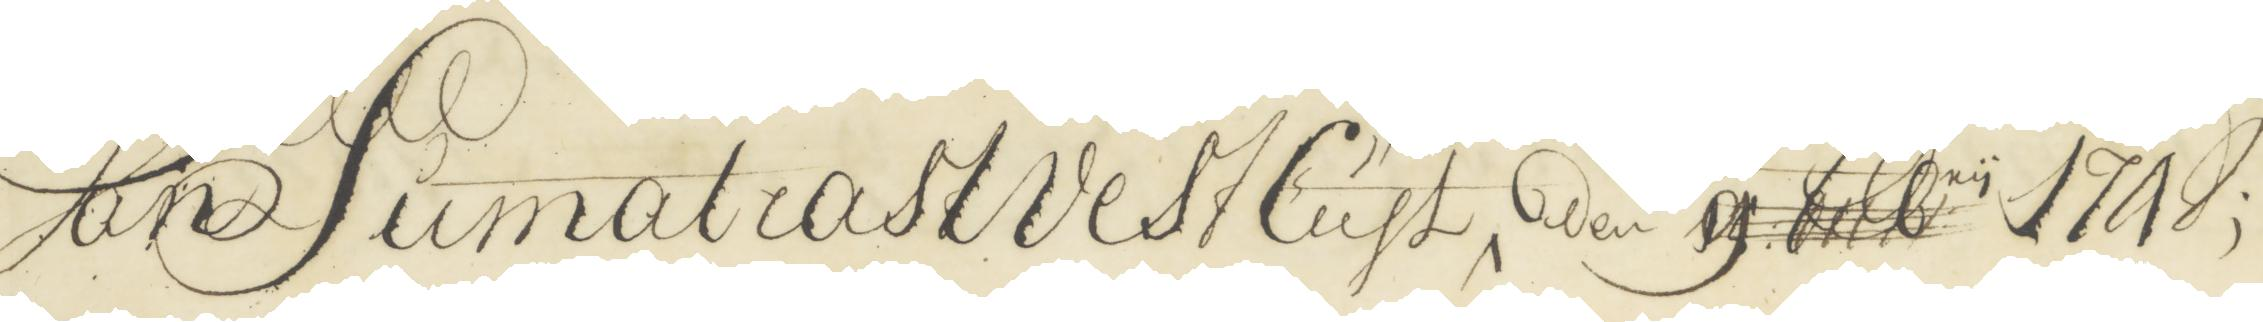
Van Sumatras West Cust ^ den 14 bnb:rij 1748;
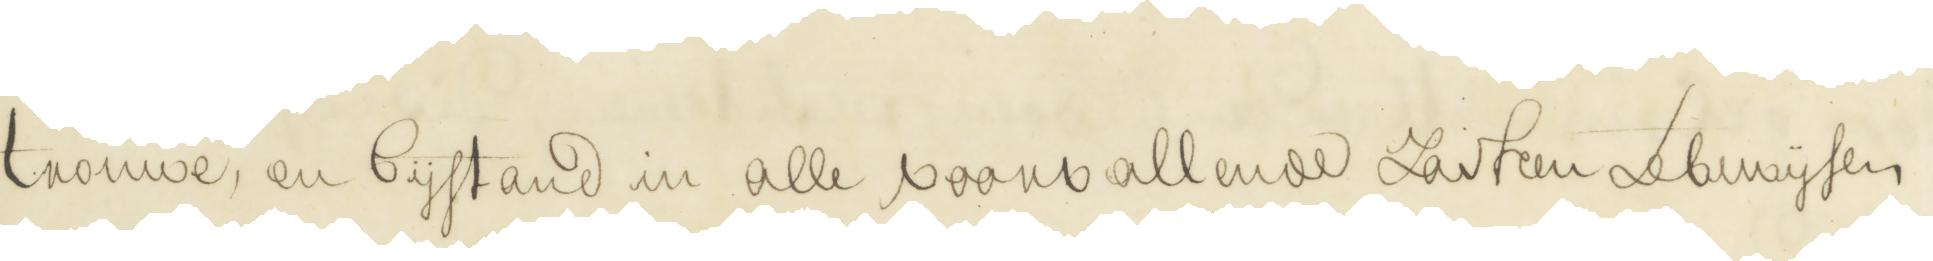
trouwe, en bijstand in alle voorvallende zaeken te bewijsen
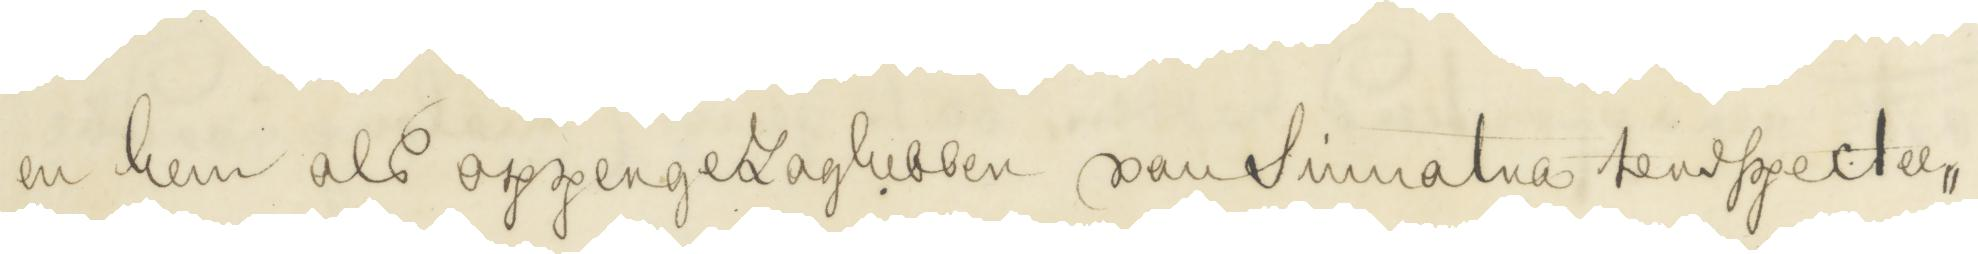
en hem als oppergezaghebber van sumatra te respectee„
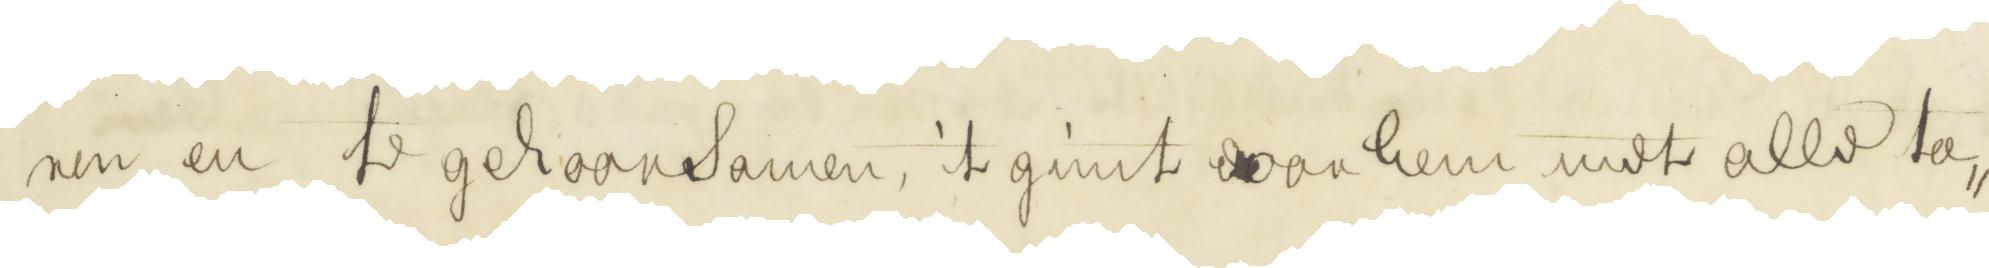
ren en te gehoorsamen, ’t gunt door hem met alle tee„
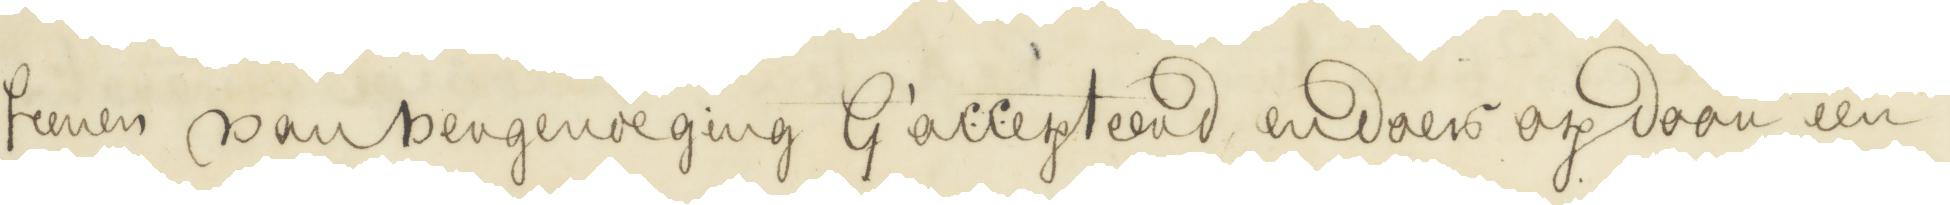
kenen van vergenoeging G'accepteerd en daer op door een
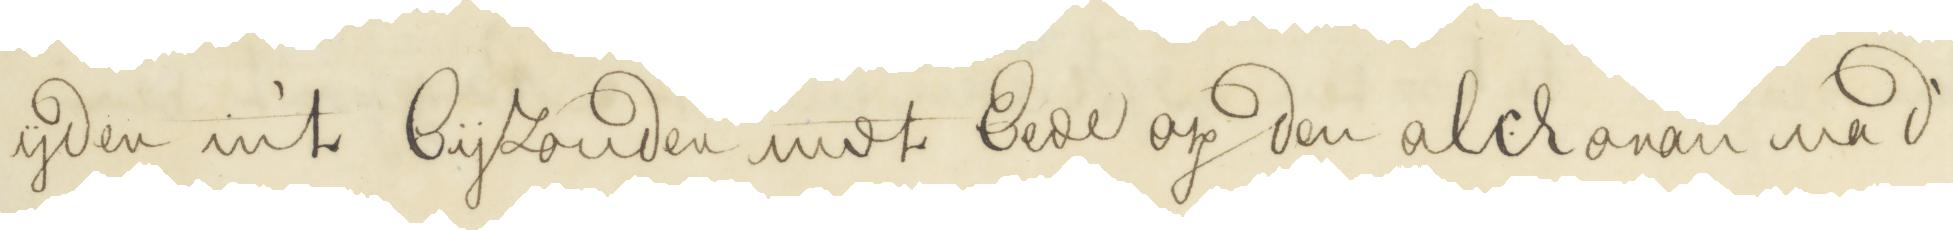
ijder in’t bijzonder met Eede op den alchoran na d'
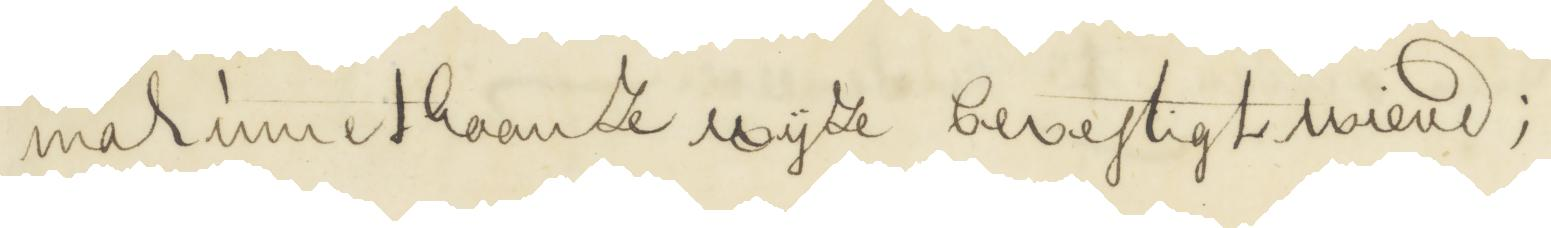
mahumithaanze wijze bevestigt wierd;
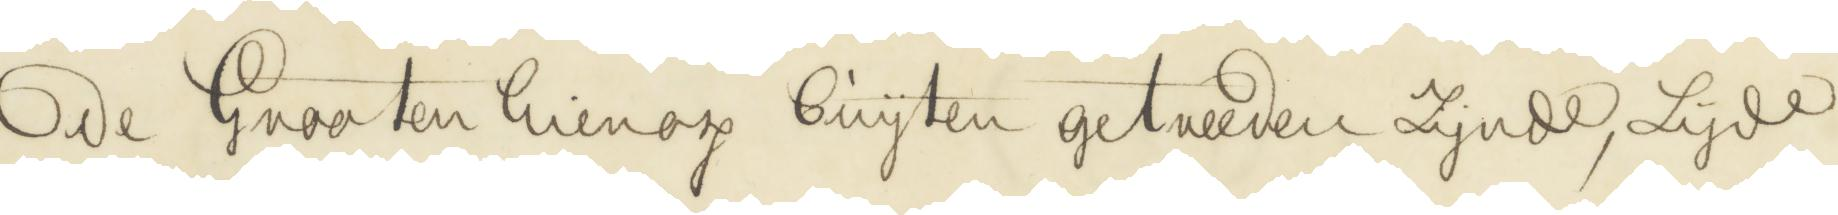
de Grooten hierop buijten getreeden zijnde, sijde
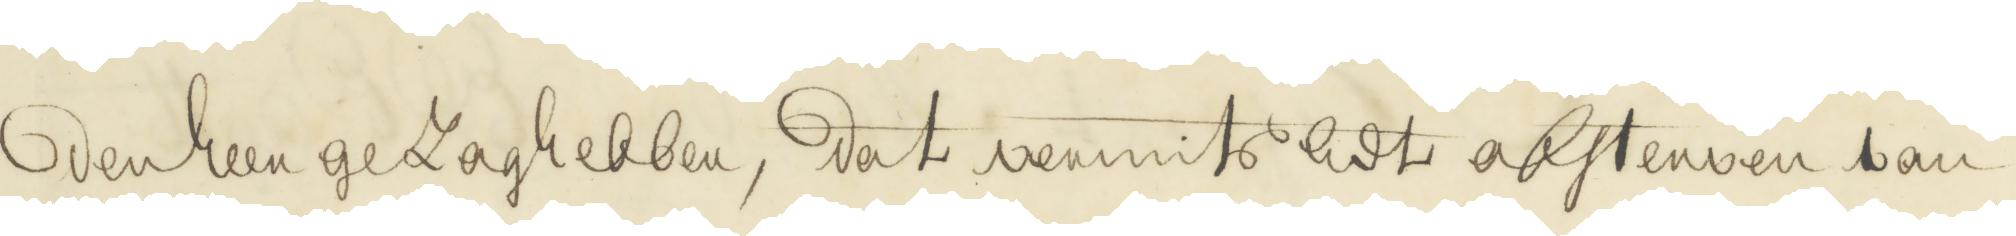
den heer gezaghebber, dat vermits het afsterven van
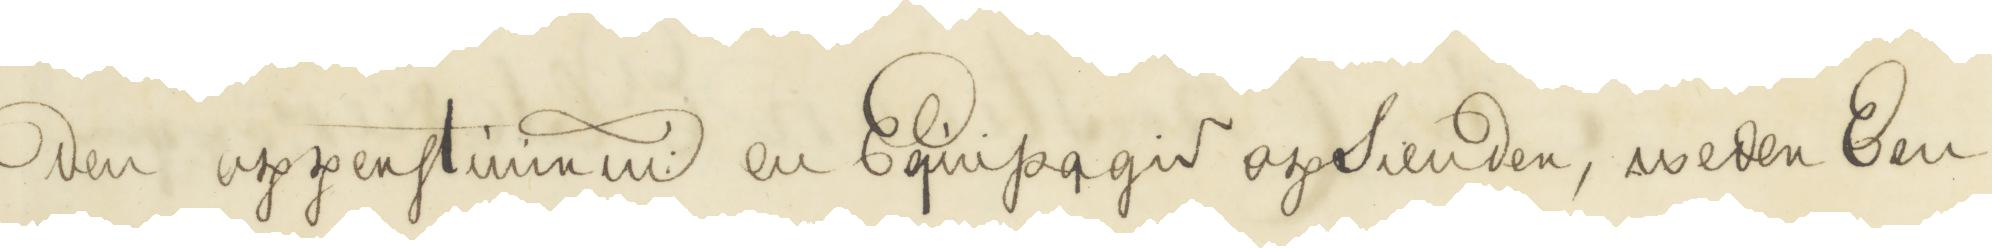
den opperstuurm: en Equipagie opsiender, weder Een
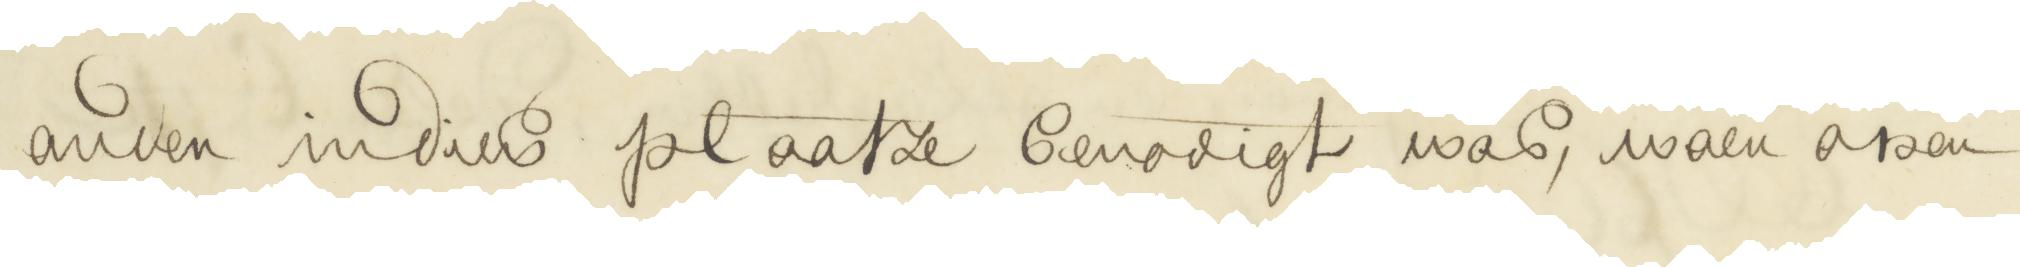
ander in diens plaatze benodigt was, waer over
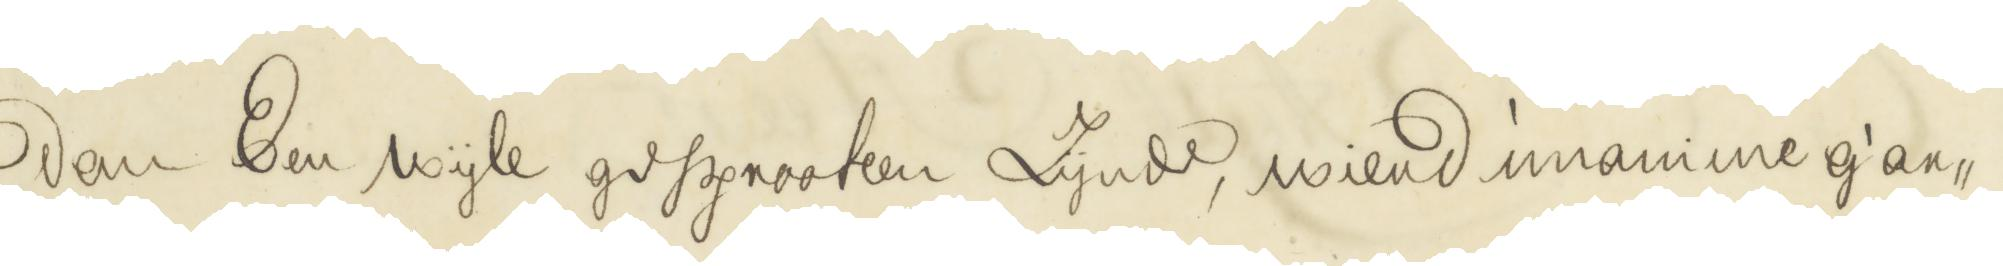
dan Een wijle gesprooken zijnde, wierd unanime g’ar„
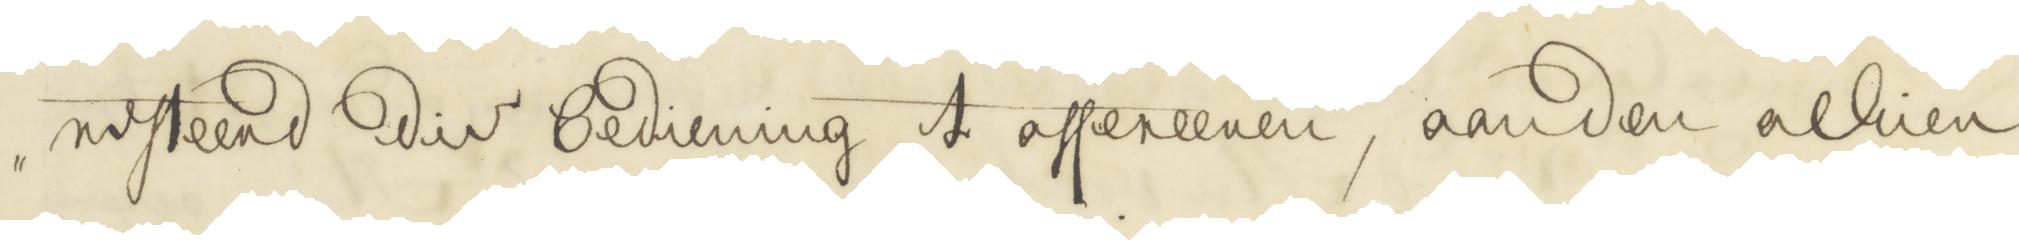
resteerd die bediening t offereeren, aan den alhier
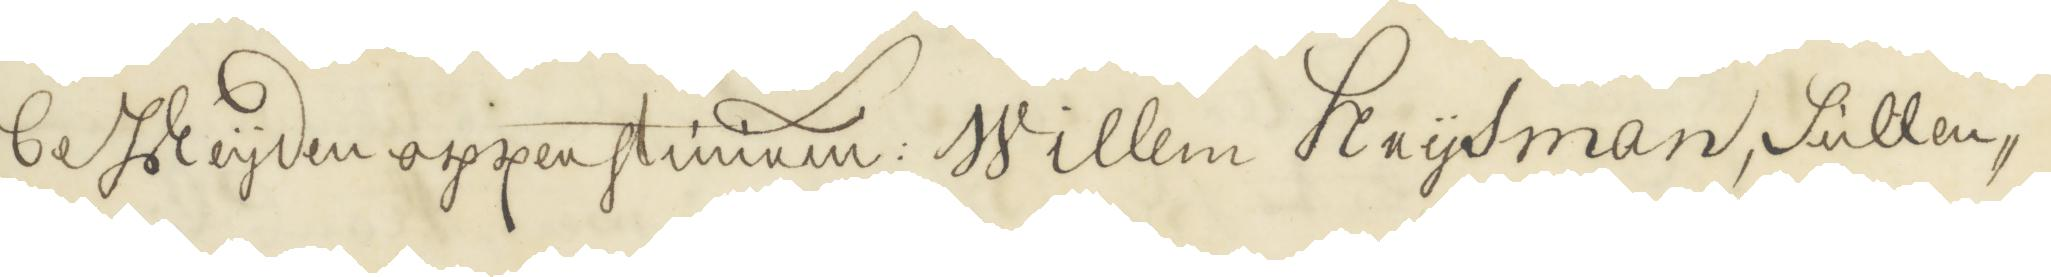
bescheijden opperstuurm: Willem Krijsman, sullen„
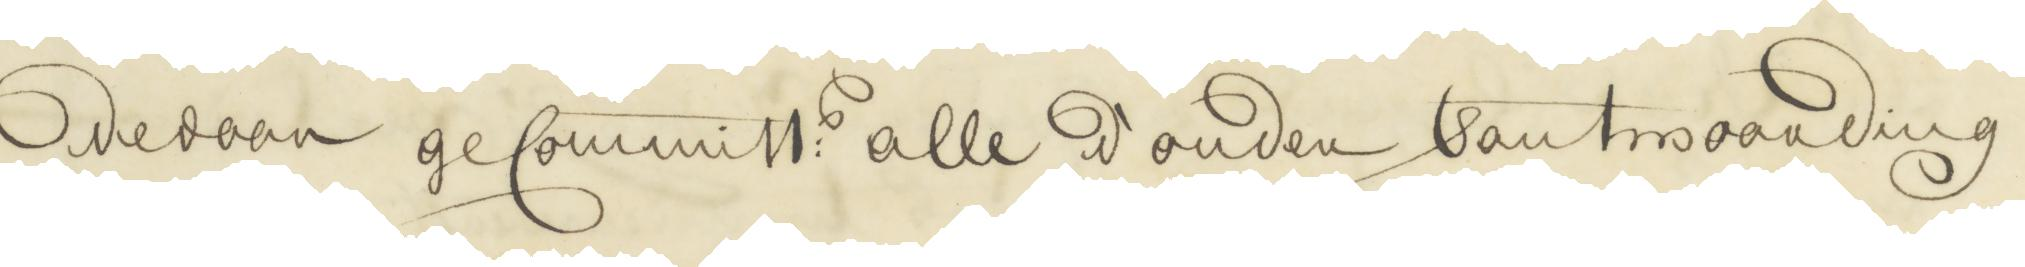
de door gecommitt:s alle d'onder verantwoording
